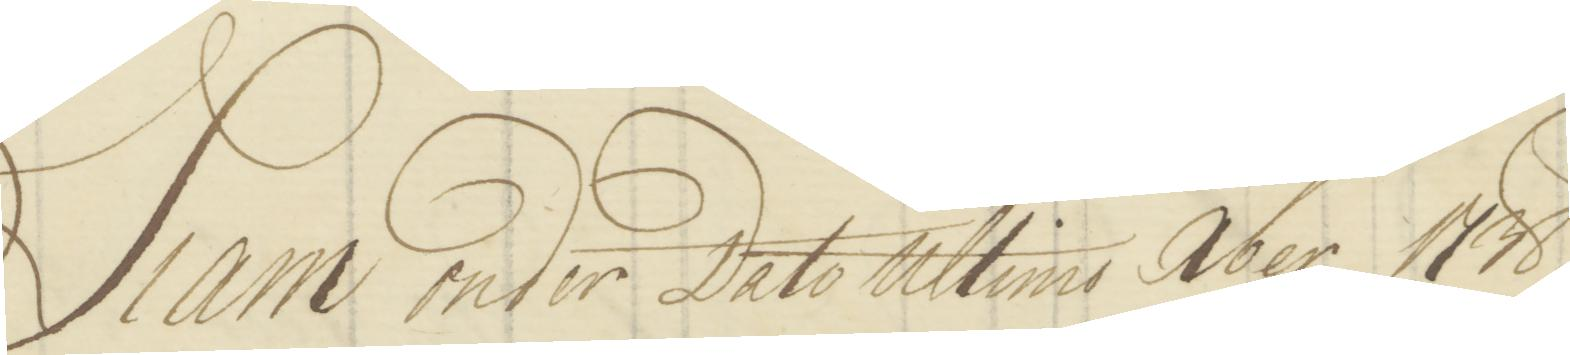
an Siam onder Dato ultimo xber 1738
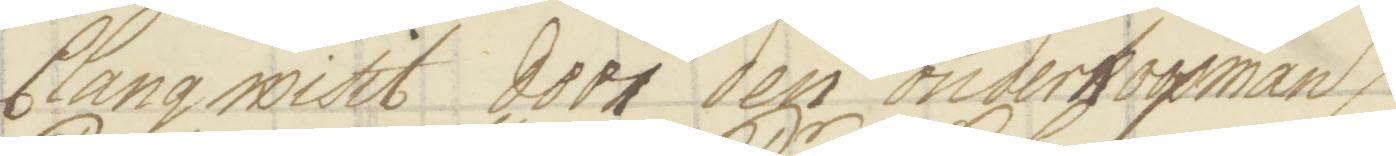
Clang wisit door den onderkoopman
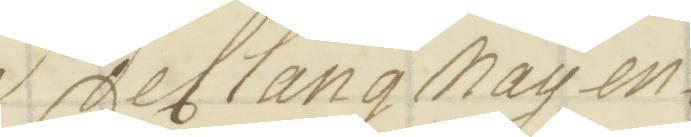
de Clang naij en
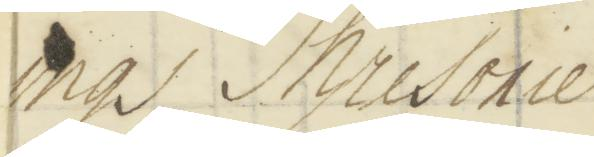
ngs Thresorie
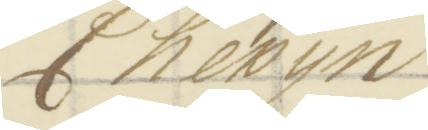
Cheryn
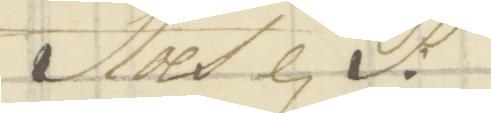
Hoes en P.r
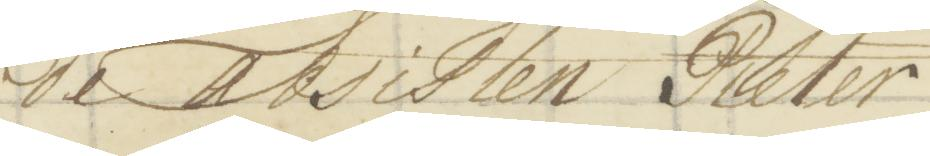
de adsisten Pieter
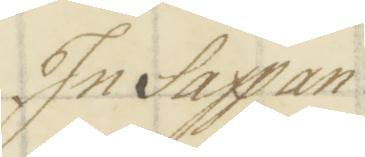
. Jn Sappan
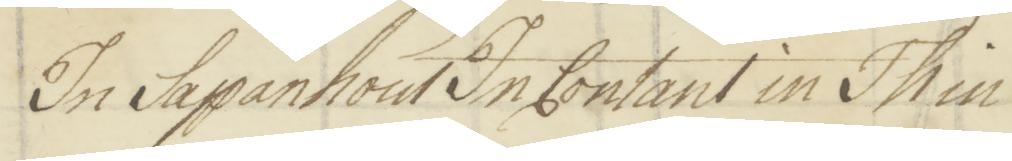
Jn Sapanhout Jn Contant in Thin
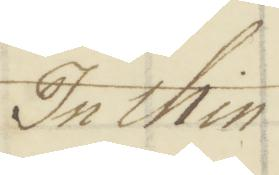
Jn thin
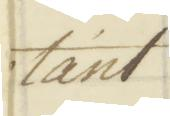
tant
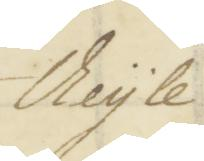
theijle
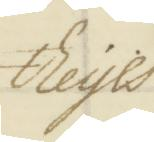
thijls
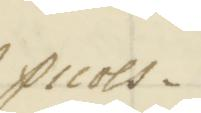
picols -
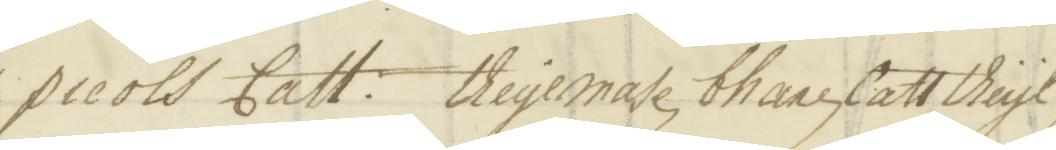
picols Catt: theije maten bharen catt theijl
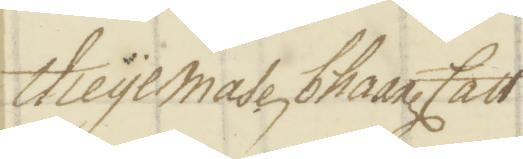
theije masen bhaaren Catt
